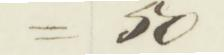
= 50
